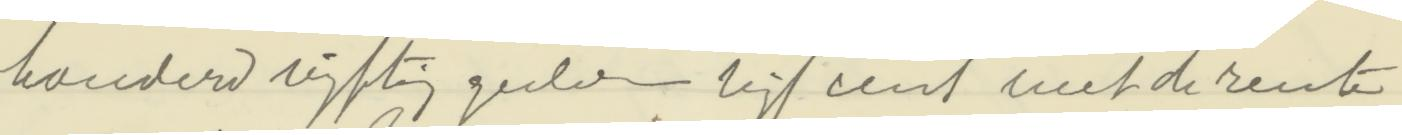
honderd vijftig gulden vijf cent met de rente
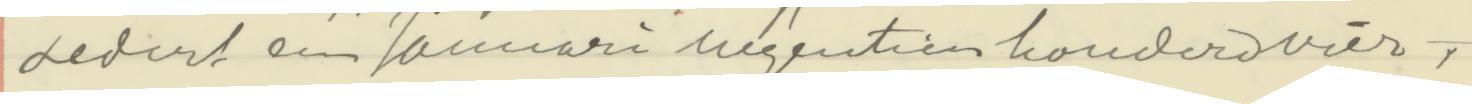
sedert een Januari negentien honderd vier
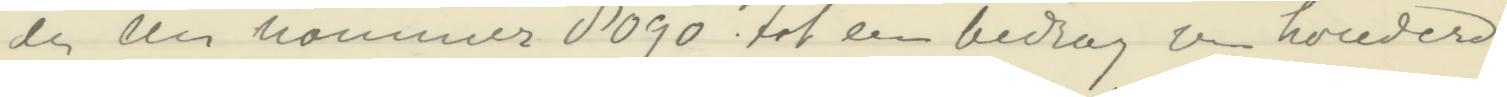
de ten nommer 8090. tot een bedrag van honderd
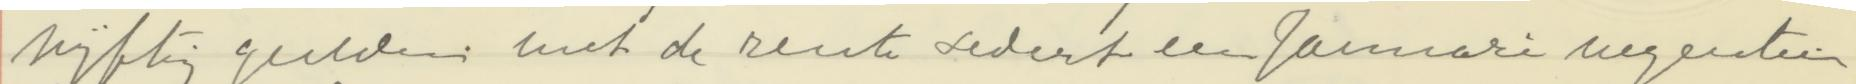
Vijftig gulden: met de rente sedert een Januari negentien
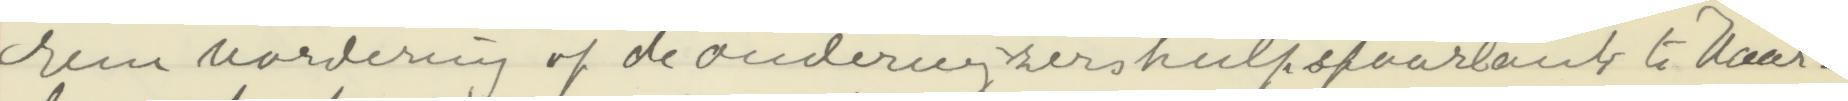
Eene vordering op de onderwijzershulpspaarbank te Haar-
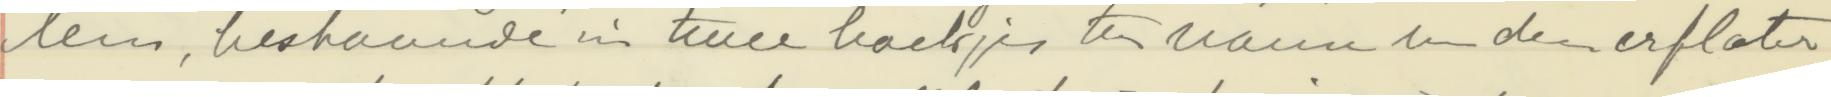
lem, bestaande in twee boekjes ten name van den erflater
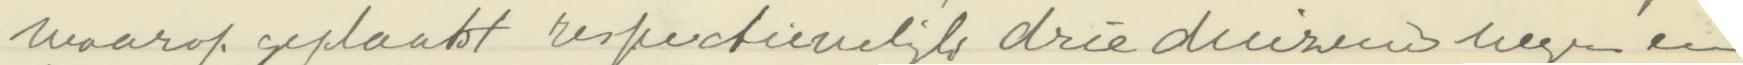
waarop geplaatst respectievelijk drie duizend negen en
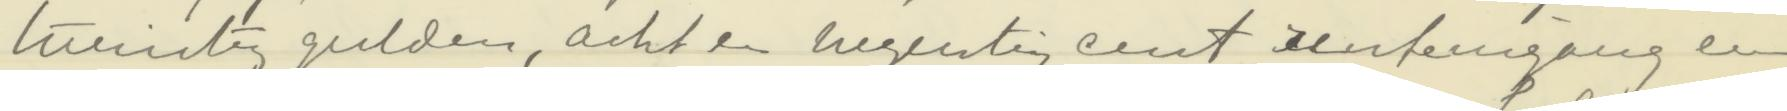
twintig gulden, acht en negentig cent, renteingang een
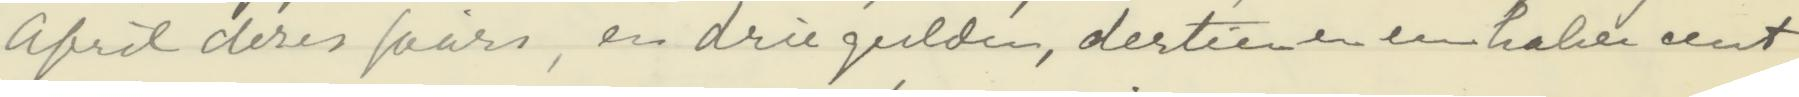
April dezes Jaars, en drie gulden, dertien en een halve cent
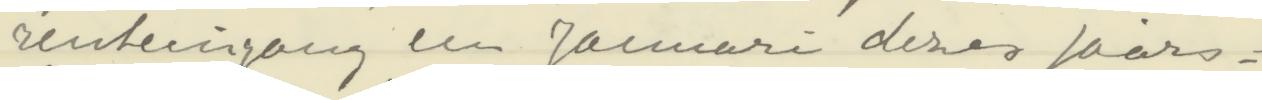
renteingang een Januari dezes jaars-
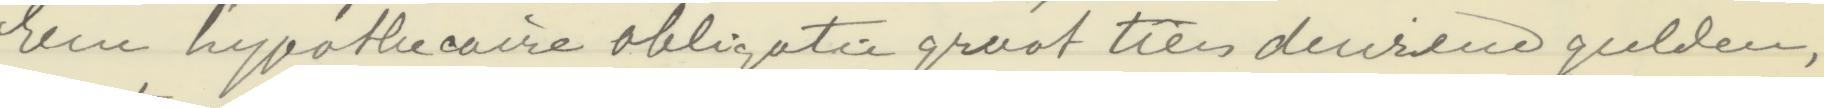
Eene hypothecaire obligatie groot tien duizend gulden
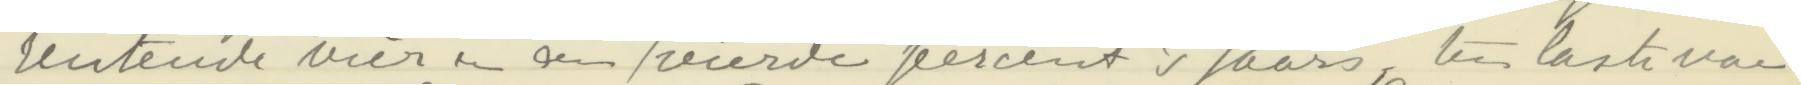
rentende vier en een /vierde percent 's Jaars, ten laste van
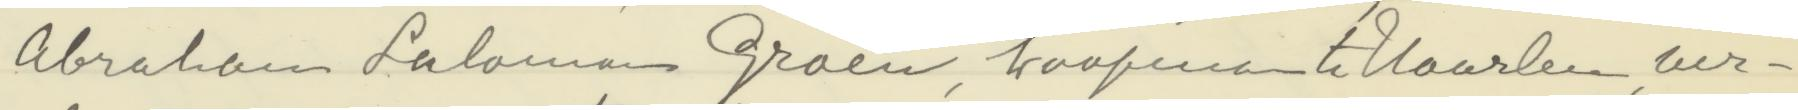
Abraham Salomon Groen, koopman te Haarlem, ver-
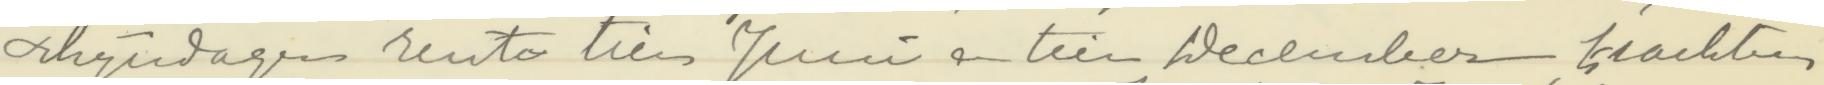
schijndagen rente tien Juni en tien December krachtens
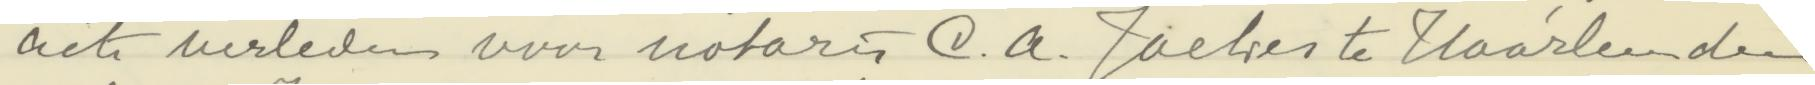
acte verleden voor notaris C. A. Joekes te Haarlem den
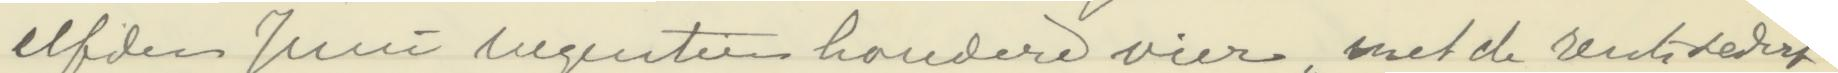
elfden Juni negentien honderd vier, met de rente sedert
